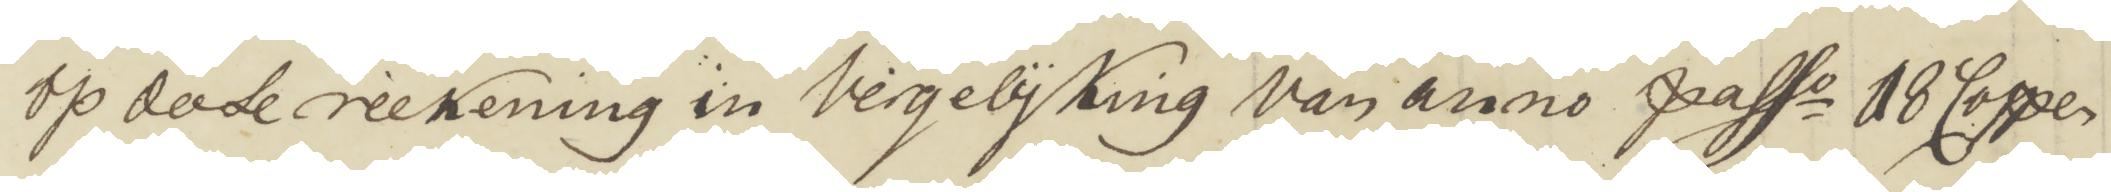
op deese reekening in Vergelijking van anno pass=o 48 Coppen
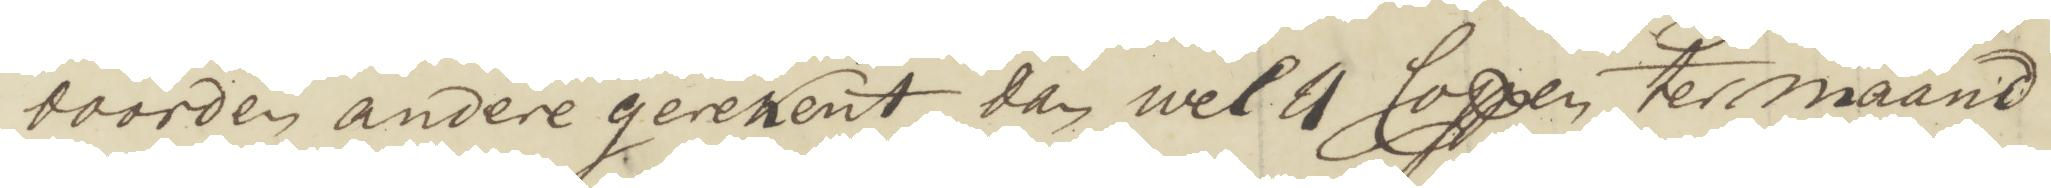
doorden andere gerekent dan wel 4 Coppen ter maand
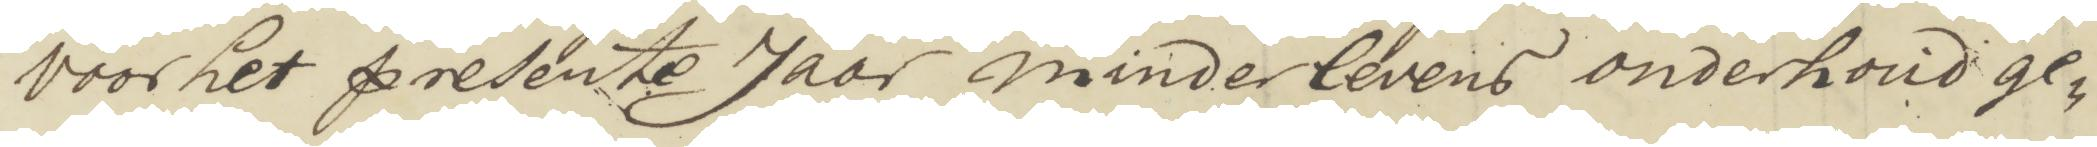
voor het presente Jaar minder levens onderhoud ge„
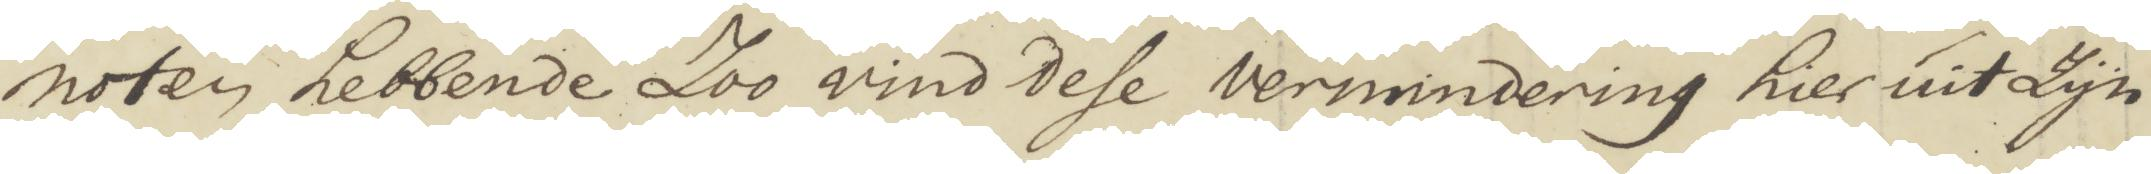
noten hebbende zoo vind dese vermindering hier uit zijn
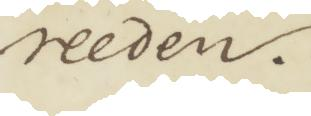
reeden.
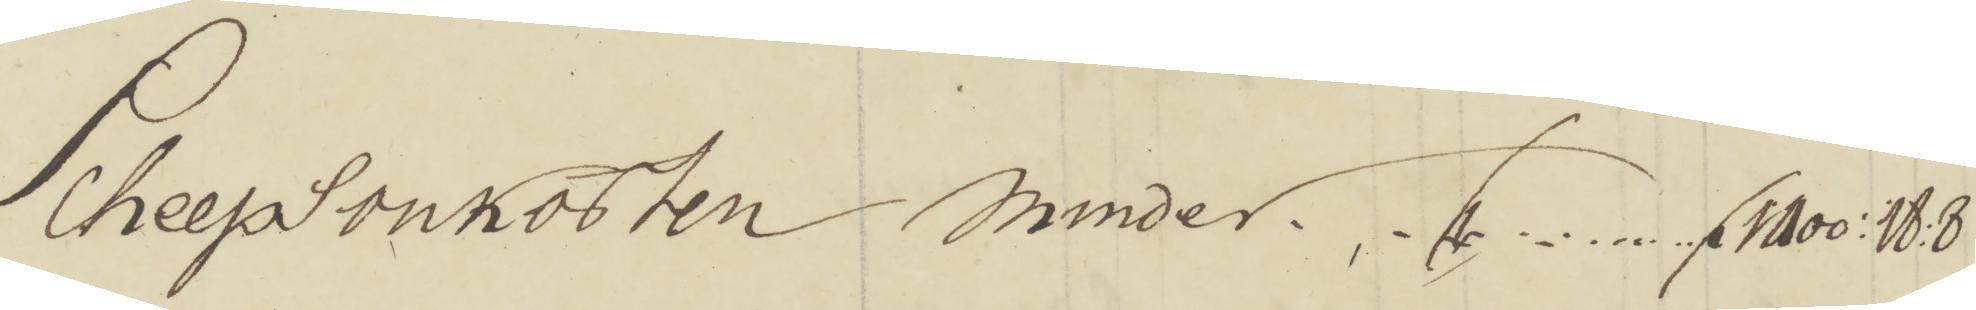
Scheepsonkosten Minder - , - ƒ - - - - - - - - - ƒ 1400:18: 8
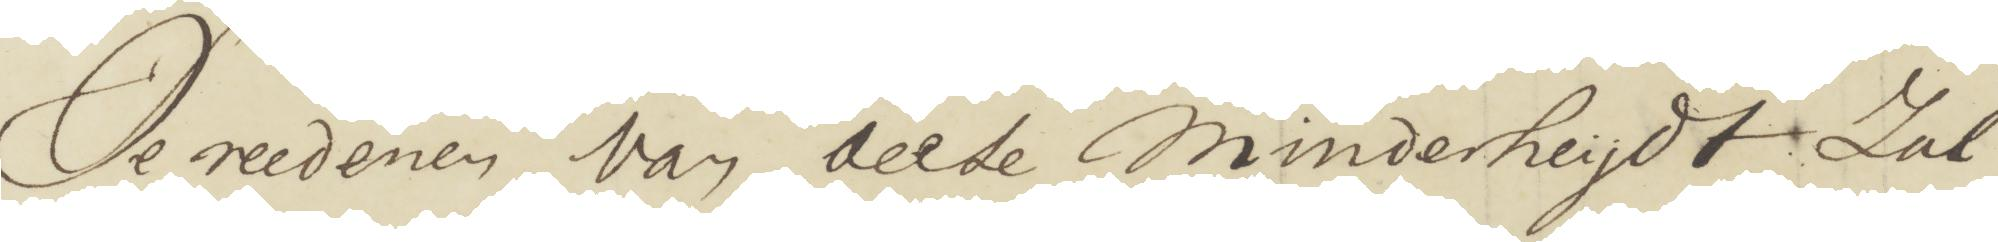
De reedenen van deese Minderheijdt zal
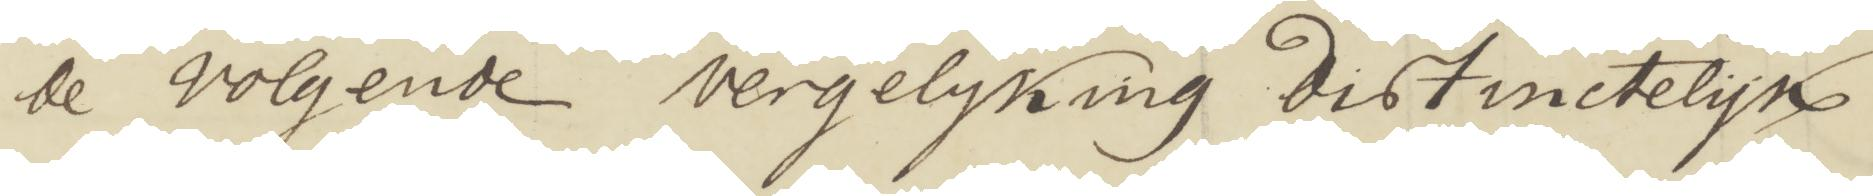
de volgende vergelyking distinctelijk
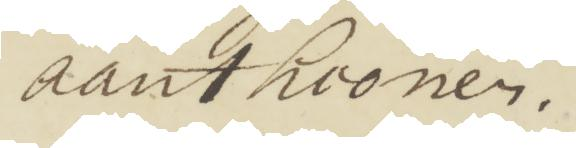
aanthoonen.
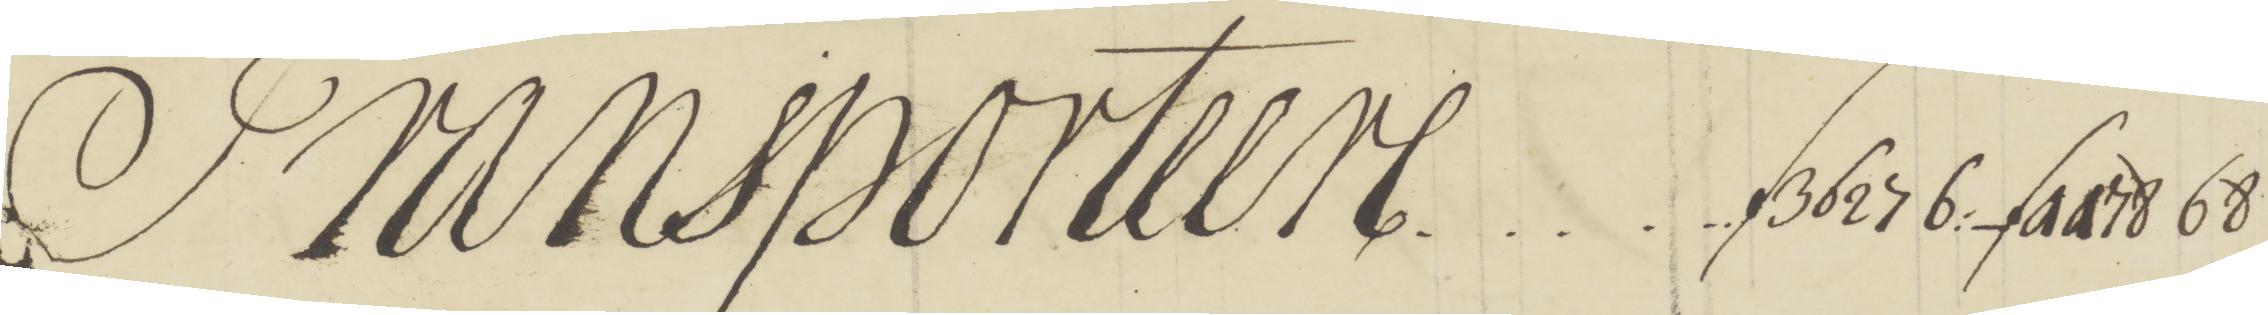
Transporteere - - - - - - ƒ 3627 6: — ƒ 4478 6 8
